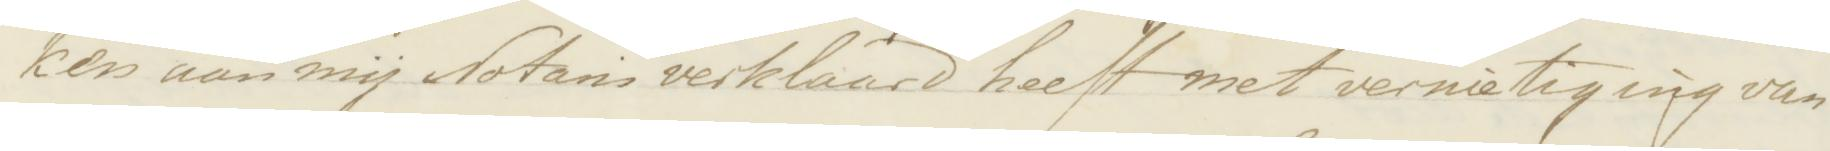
ken aan mij Notaris verklaard heeft met vernietiging van
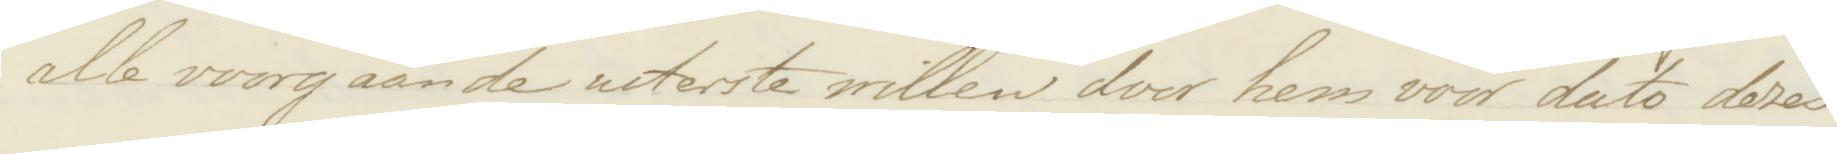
alle voorgaande uiterste willen door hem voor dato dezes
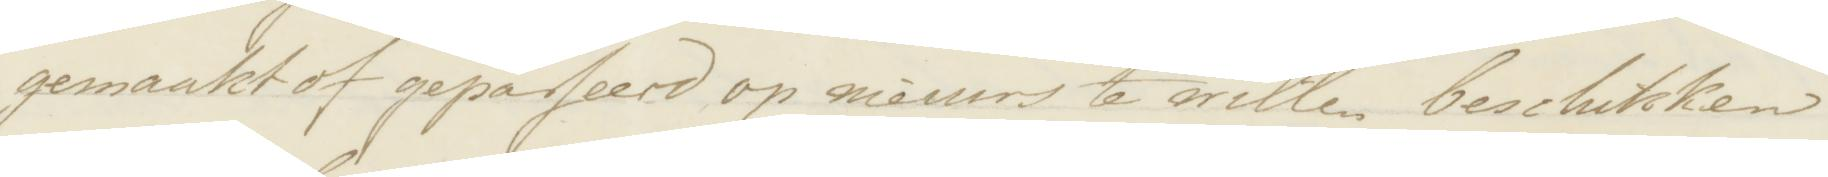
gemaakt of gepasseerd op nieuw te willen beschikken
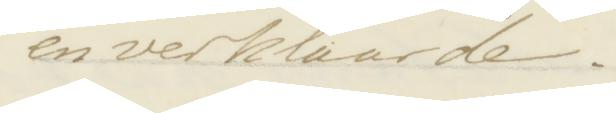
en verklaarde.
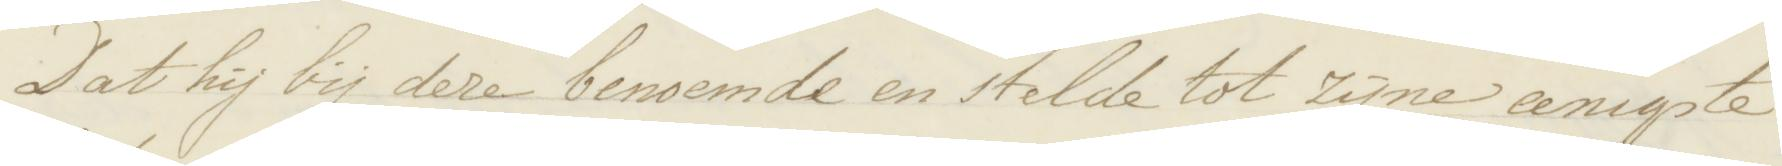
Dat hij bij deze benoemde en stelde tot zijne eenigste
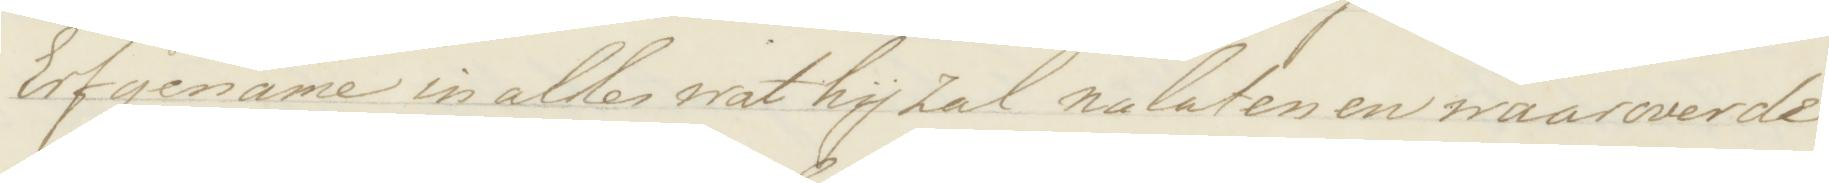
Erfgename in alles wat hij zal nalaten en waarover de
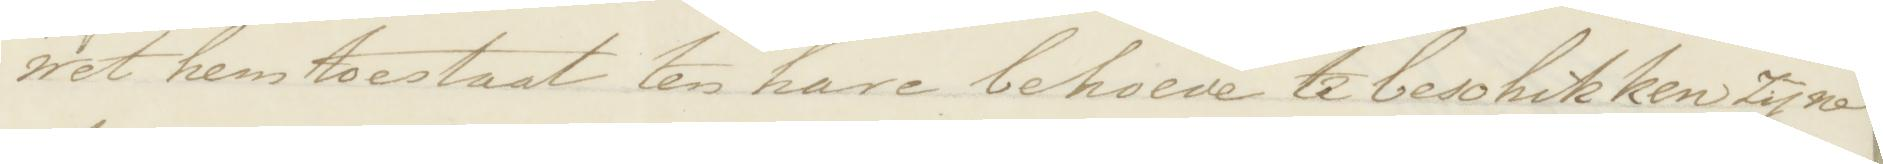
wet hem toestaat ten hare behoeve te beschikken zijne
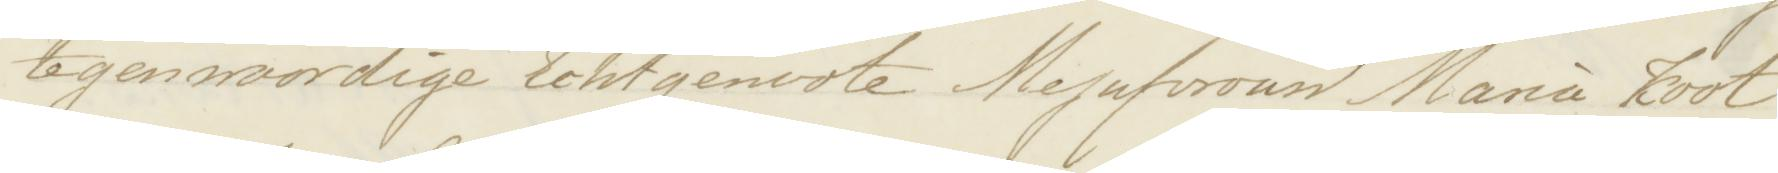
tegenwoordige Echtgenoote Mejufvrouw Maria koot
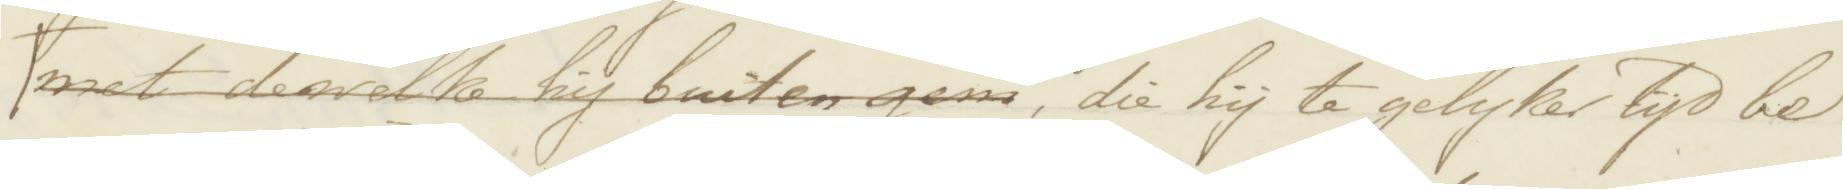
¶ met dewelke hij buitengem, die hij te gelyker tijd be
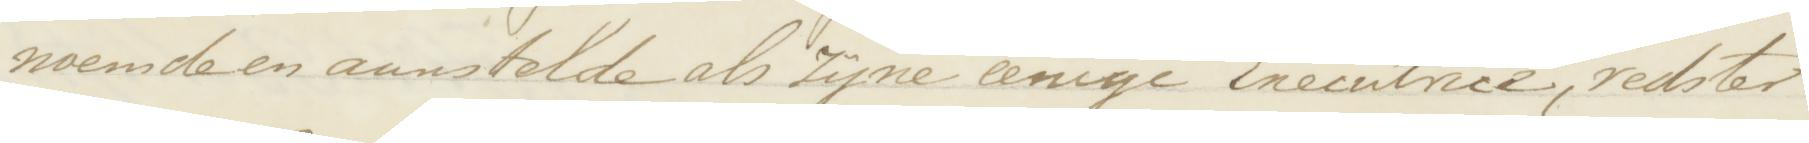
noemde en aanstelde als zijne eenige Executrice, redster
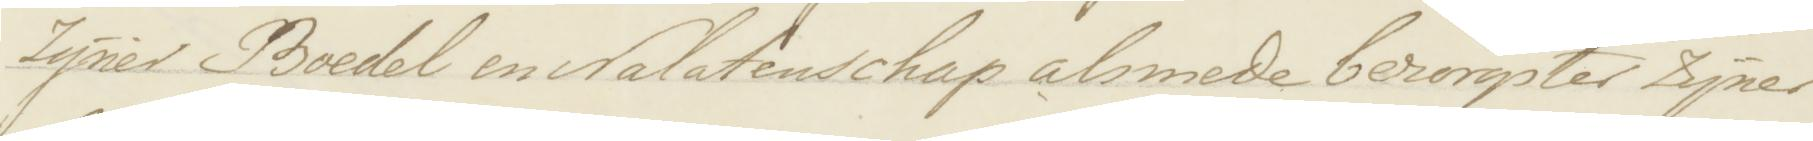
zijner Boedel en Nalatenschap alsmede beroepster zijner
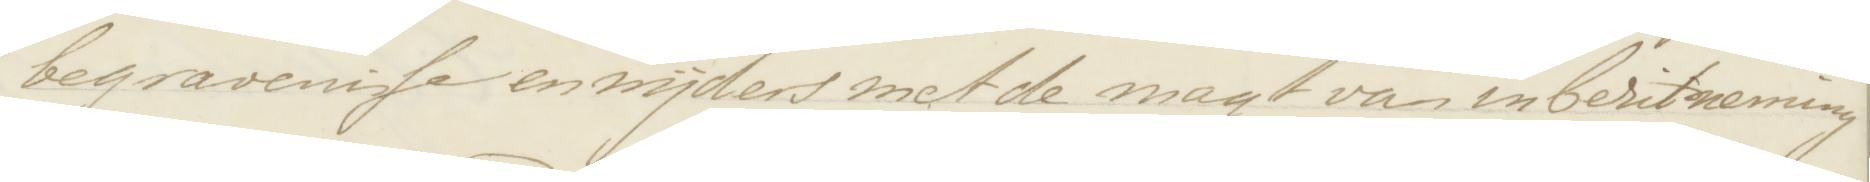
begravenise en wijders met de magt van inbezitneming
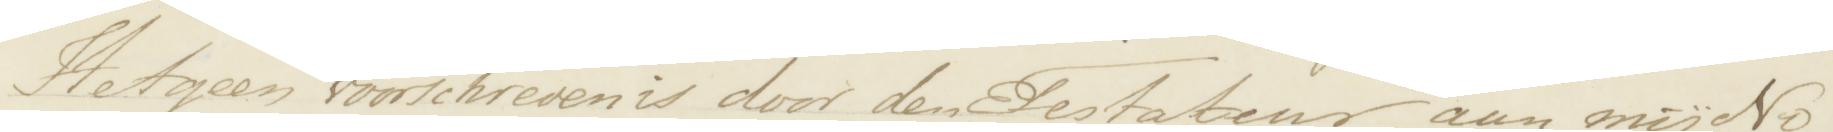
Hetgeen voorschreven is door den Testateur aan mij No
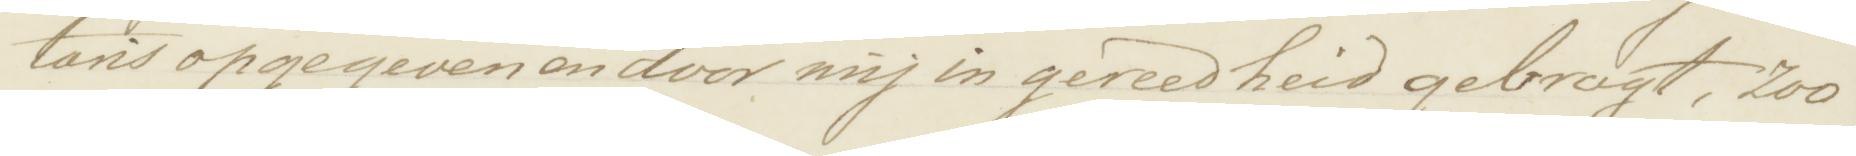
taris opgegeven en door nij in gereedheid gebragt, zoo
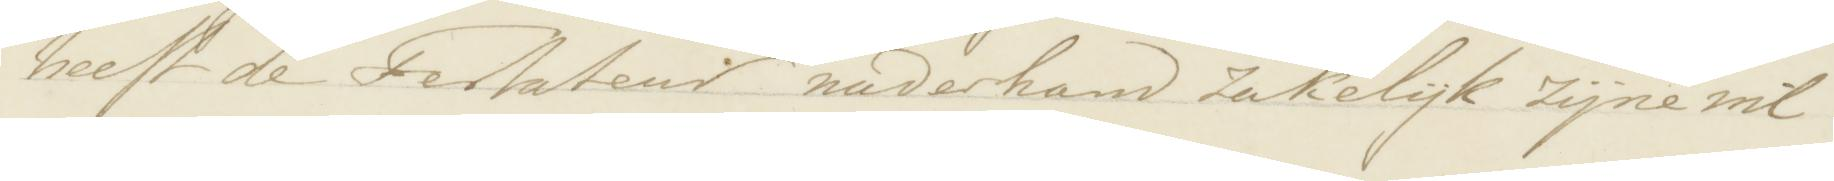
heeft de Testateur nader hand zakelijk zijne wil
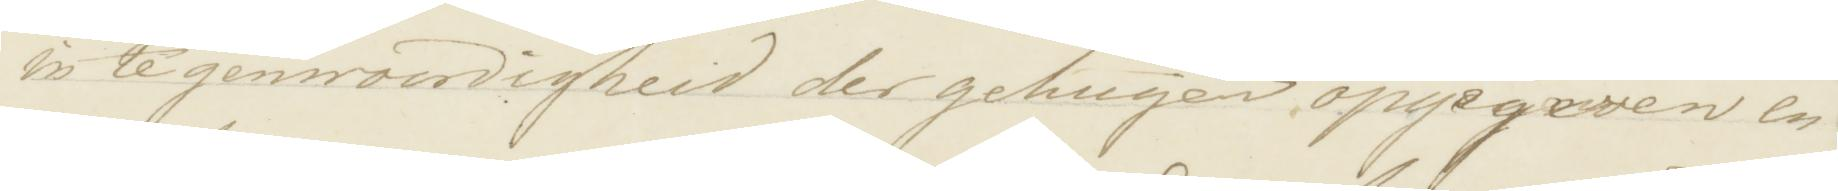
in tegenwoordigheid der getuigen opgegeven en
